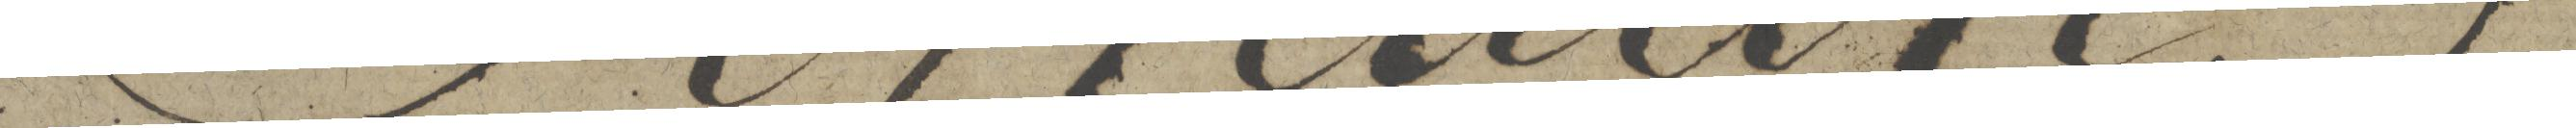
Ternaten,
